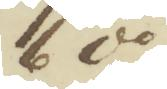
6 d.o
